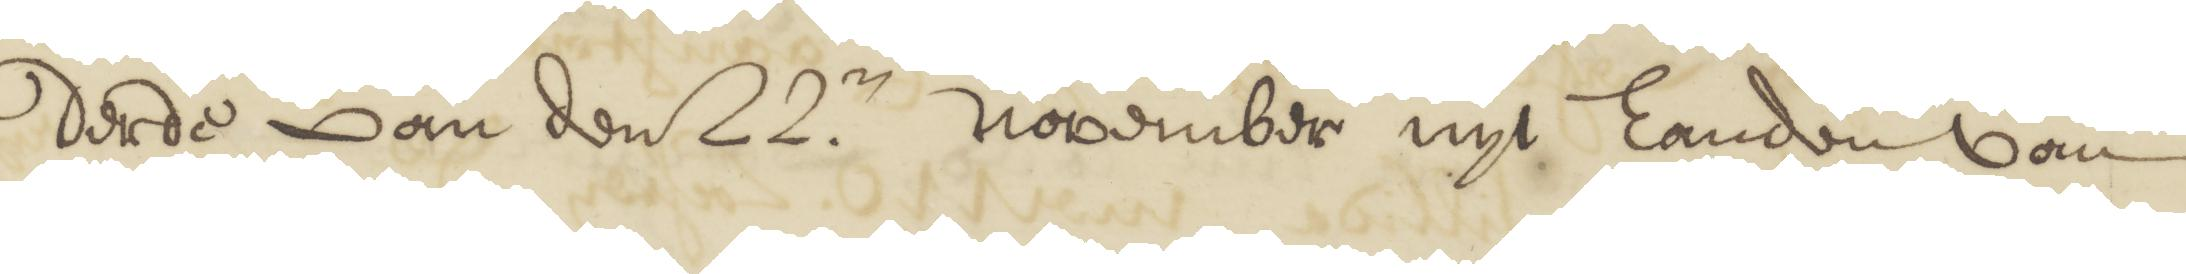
derde van den 22.n november uijt handen van
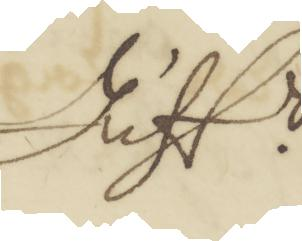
Juff.
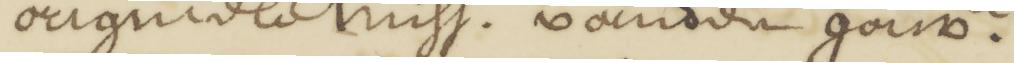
originele miss. vanden gouv.r
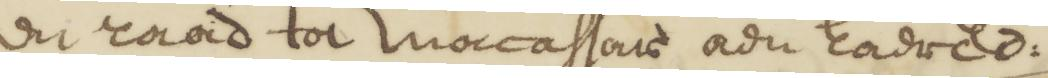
en raad tot macassar aen haerEd:
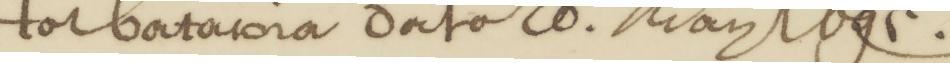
tot batavia dato 20. may 1695.
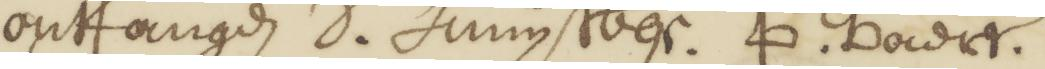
ontfangen 8. Junij 1695. p.r vaert.
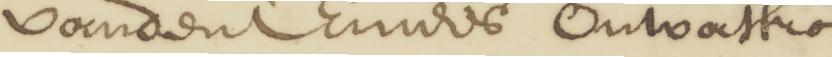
van den Chinees Onwatko
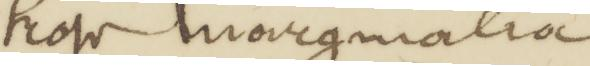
kote marginalia
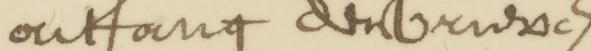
ontfang der brieven
